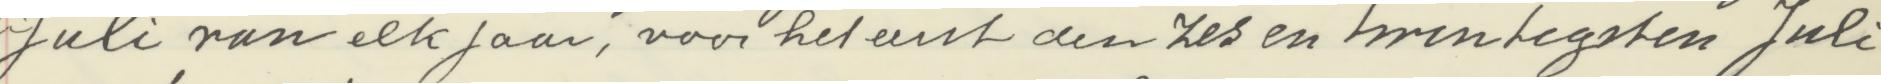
Juli van elk jaar, voor het eerst den zes en twintigsten Juli
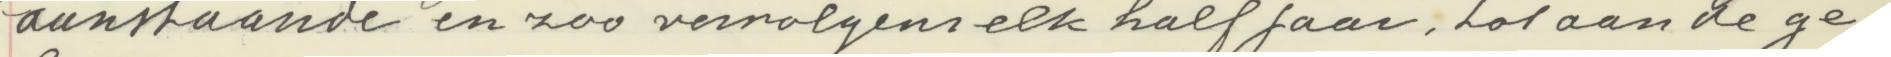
aanstaande en zoo vervolgens elk half jaar, tot aan de ge
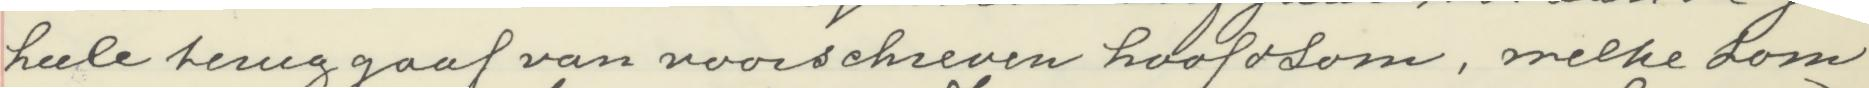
heele teruggaaf van voorschreven hoofdsom, welke som
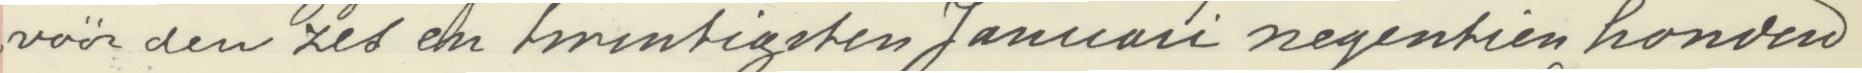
voór den zes en twintigsten Januari negentien honderd
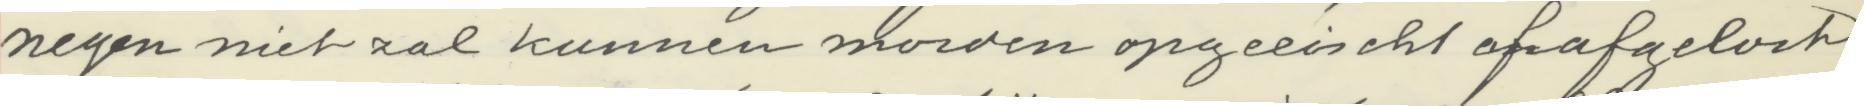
negen niet zal kunnen worden opgeeischt of afgelost
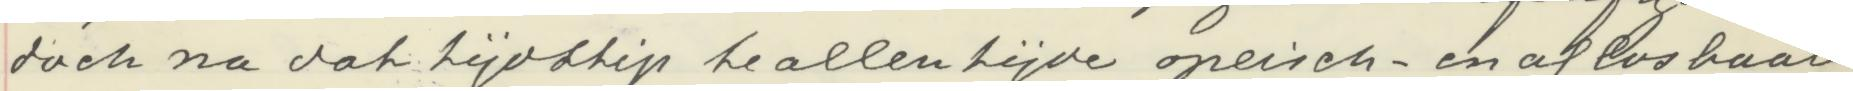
doch na dat tijdstip te allen tijde opeisch- en aflosbaar
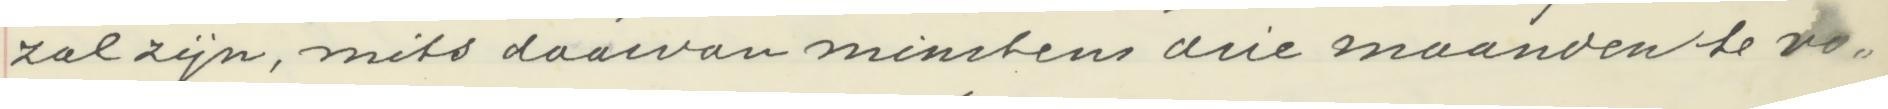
zal zijn, mits daarvan minstens drie maanden te vo„
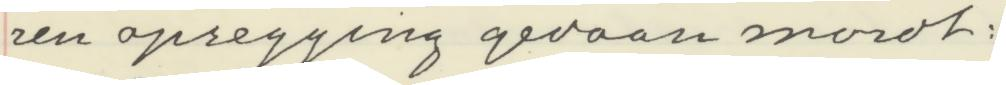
ren opzegging gedaan wordt:
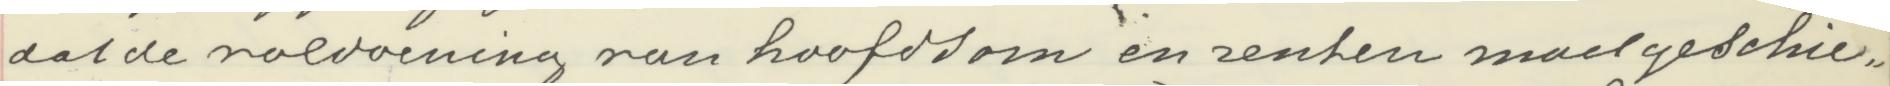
dat de voldoening van hoofdsom en renten moet geschie„
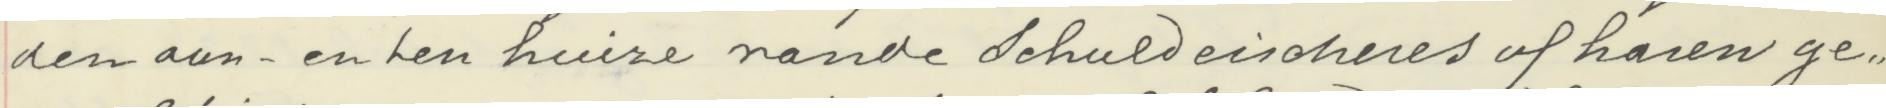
den aan- en ten huize vande schuldeischeres of haren ge„
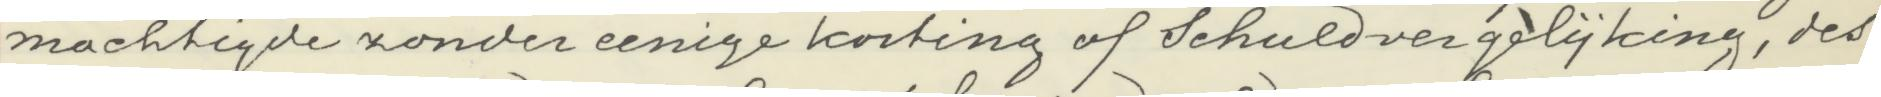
machtigde zonder eenige korting of schuldvergelijking, des
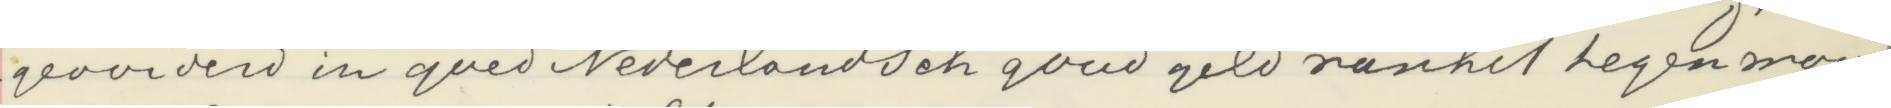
gevorderd in goed Nederlandsch goud geld van het tegenwoor
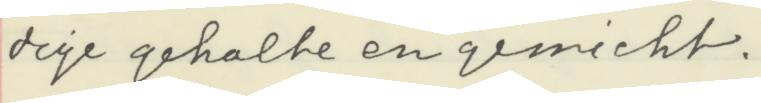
dige gehalte en gewicht.
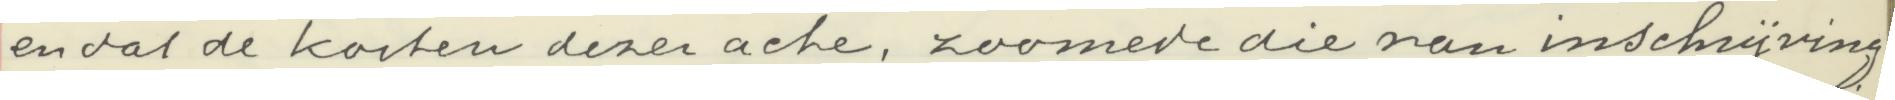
en dat de kosten dezer acte, zoomede die van inschrijving
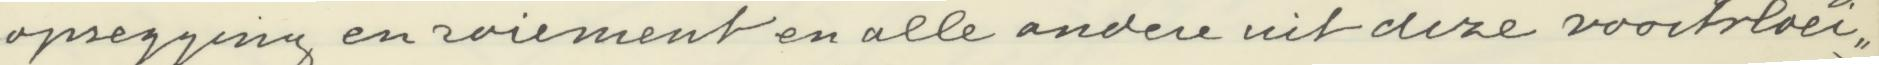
opzegging en roiement en alle andere uit deze voortvloei„
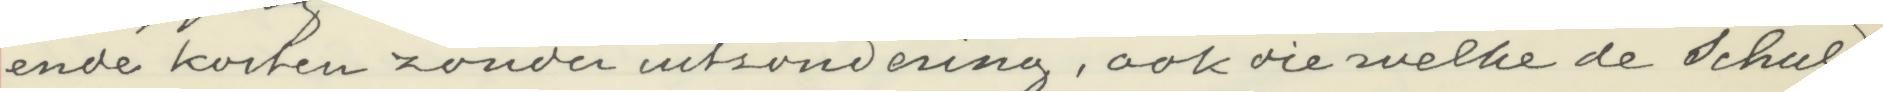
ende kosten zonder uitzondering, ook die welke de schuld
